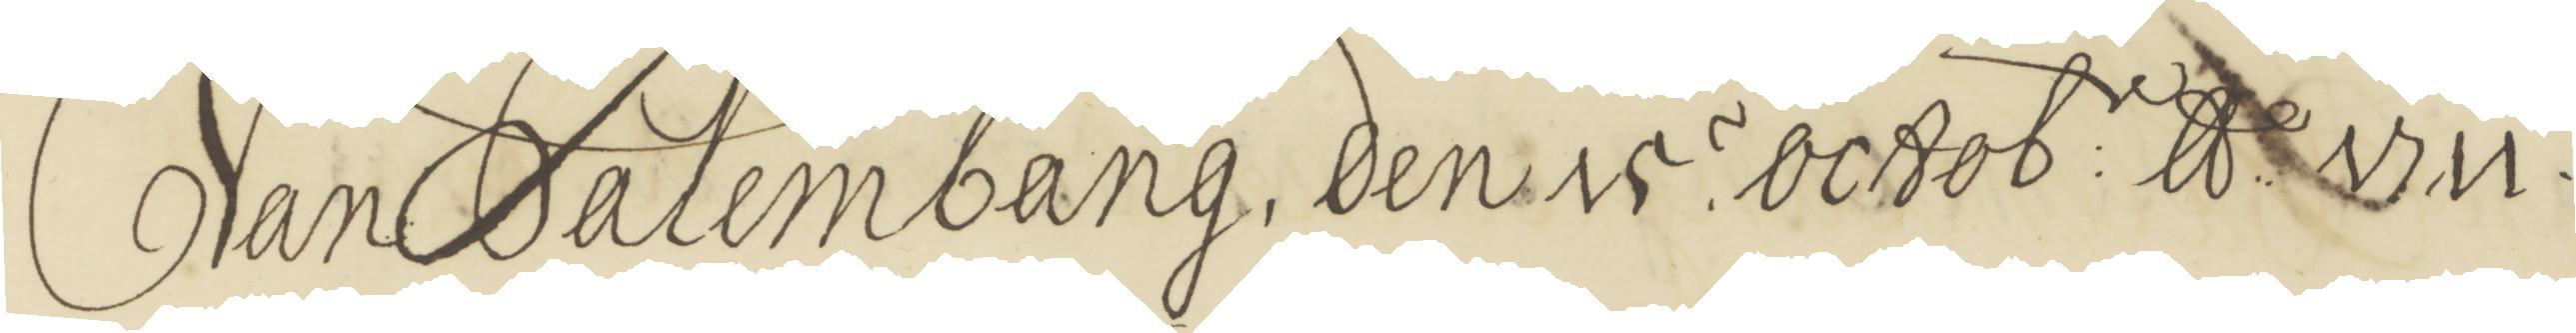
Van Palembang, den 15:' octob:r A„o 1711.
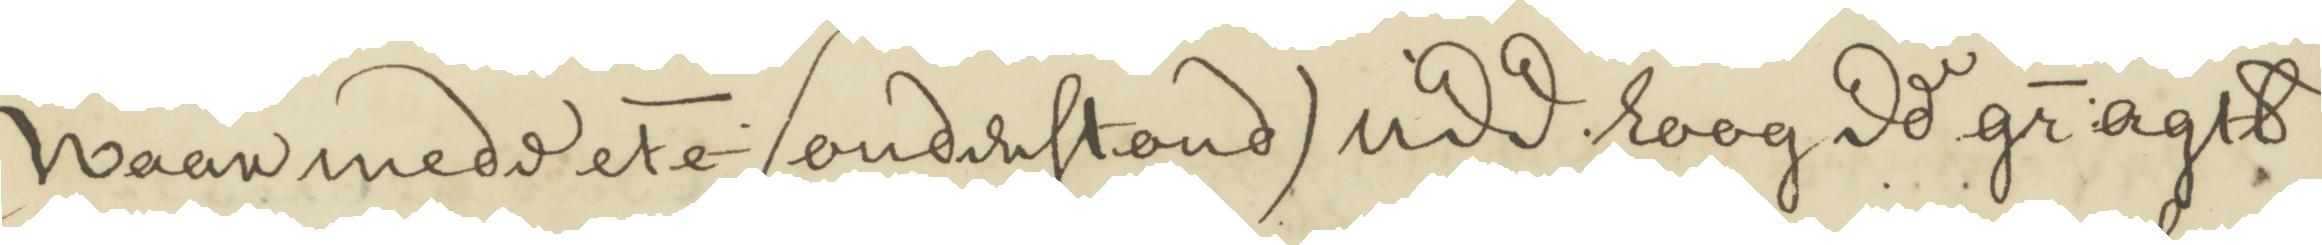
Waar mede etc: (onderstond) uEE. hoog Ed.e gr: agtb
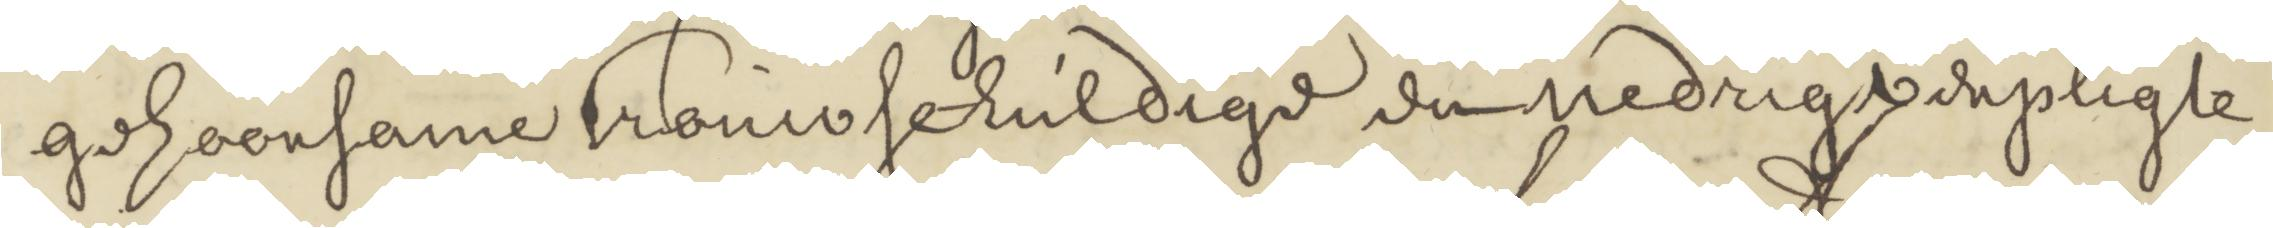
gehoorsame trouwschuldige en nedrig verpligte
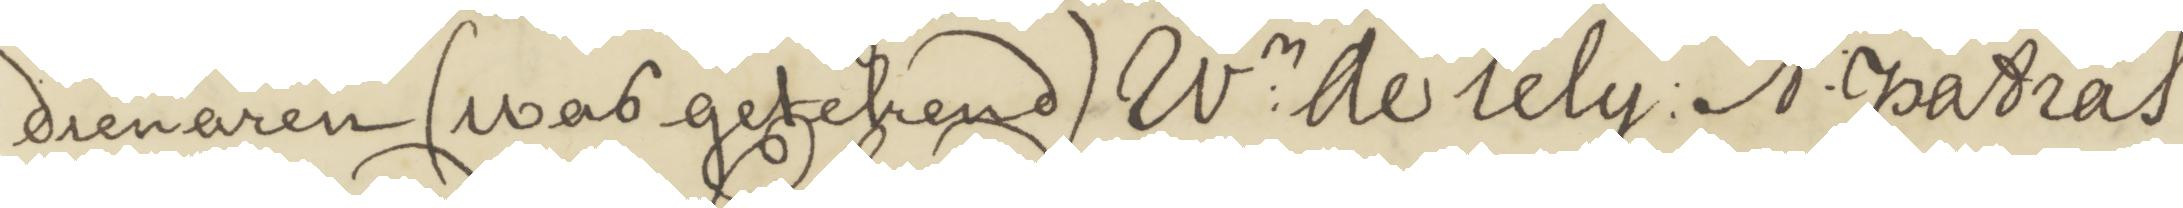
dienaren (was getekend) W:m de Lely: A: patras,
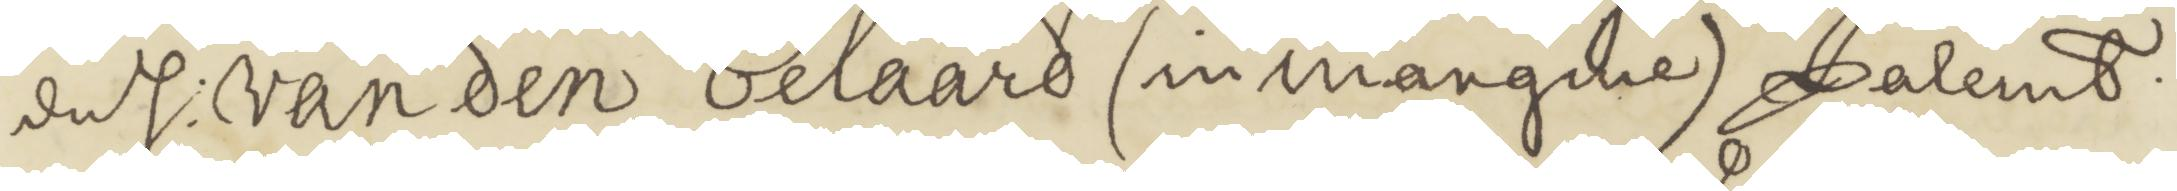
en J: van den Eelaard (in margine) palemb.
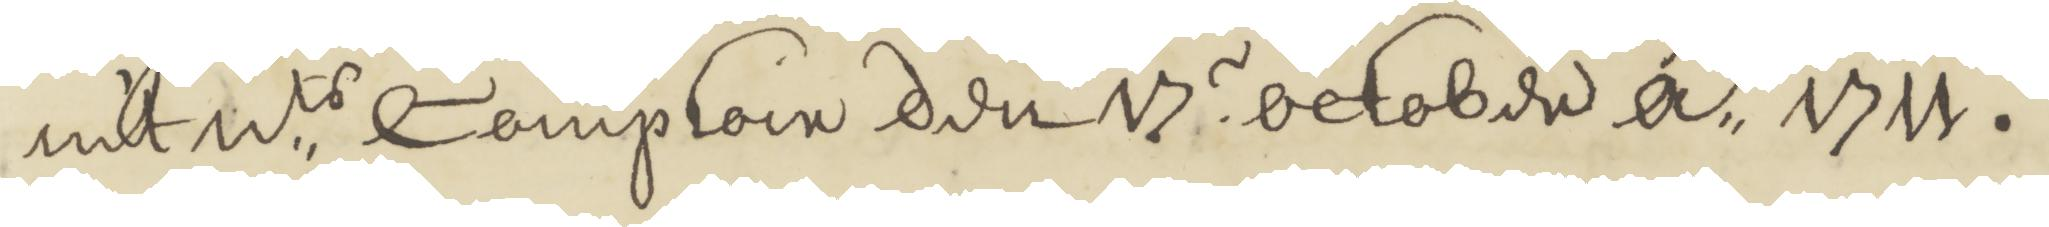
in't n„ts Comptoir den 17.' october A„o 1711.
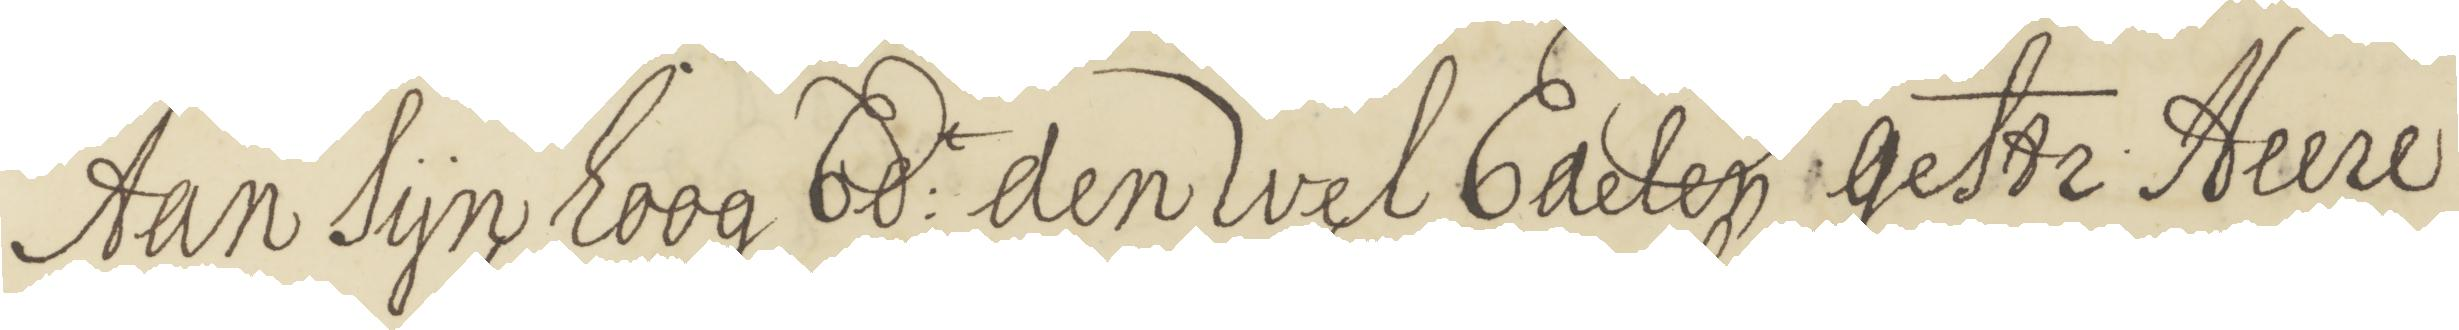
Aan sijn hoog Ed:t den Wel Edelen gestr. Heere
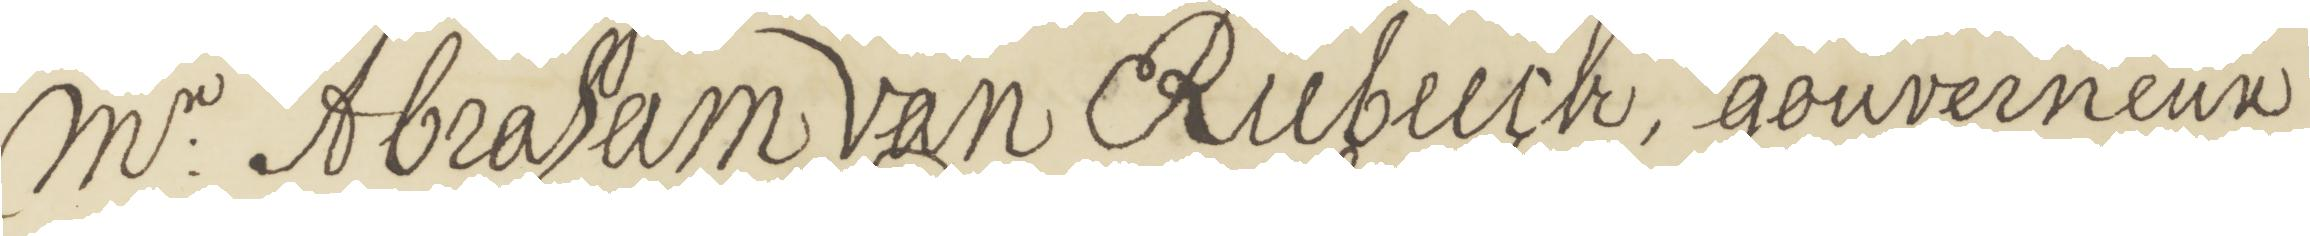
M:r Abraham van Riebeeck, gouverneur
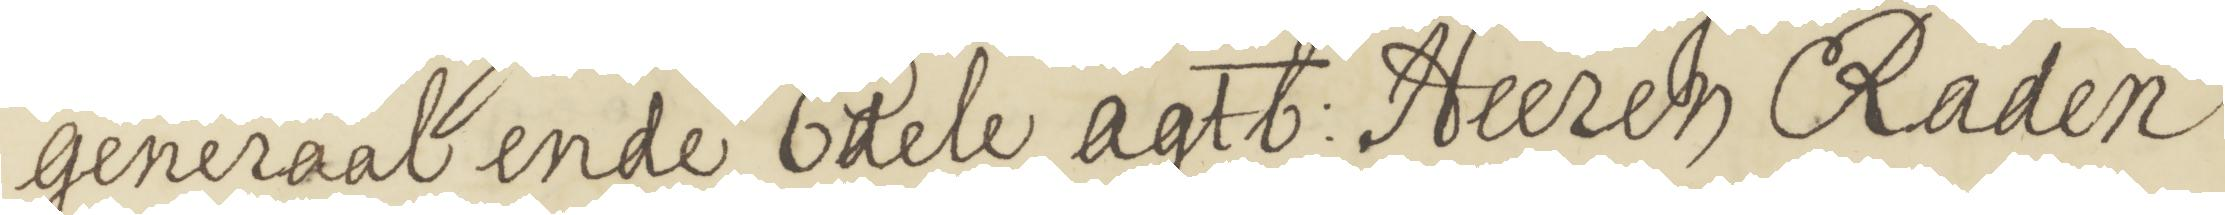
generaal ende Edele agtb: Heeren Raden
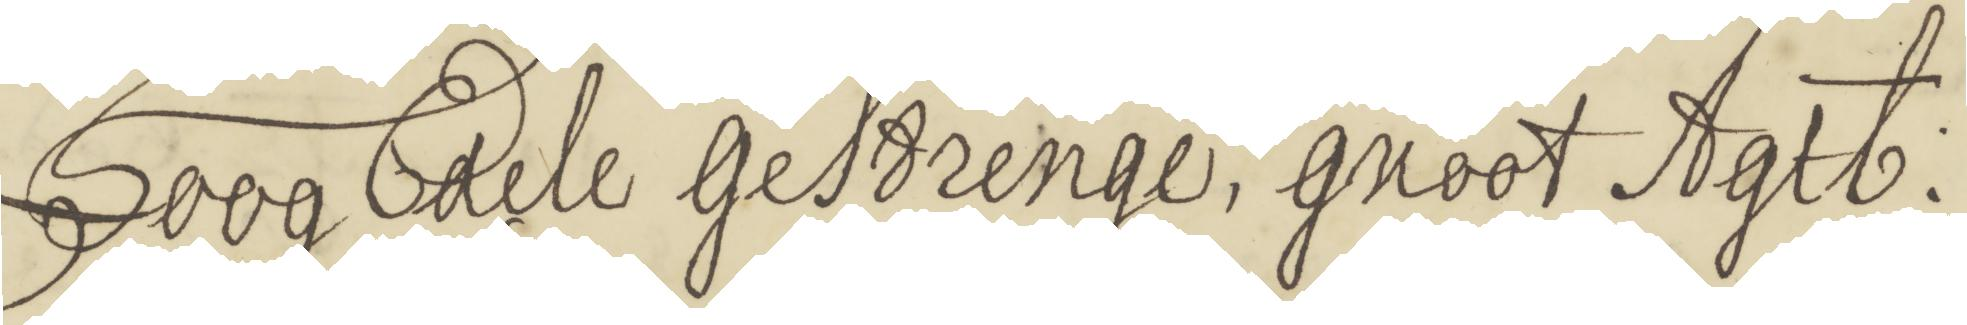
Hoog Edele gestrenge, groot Agtb:
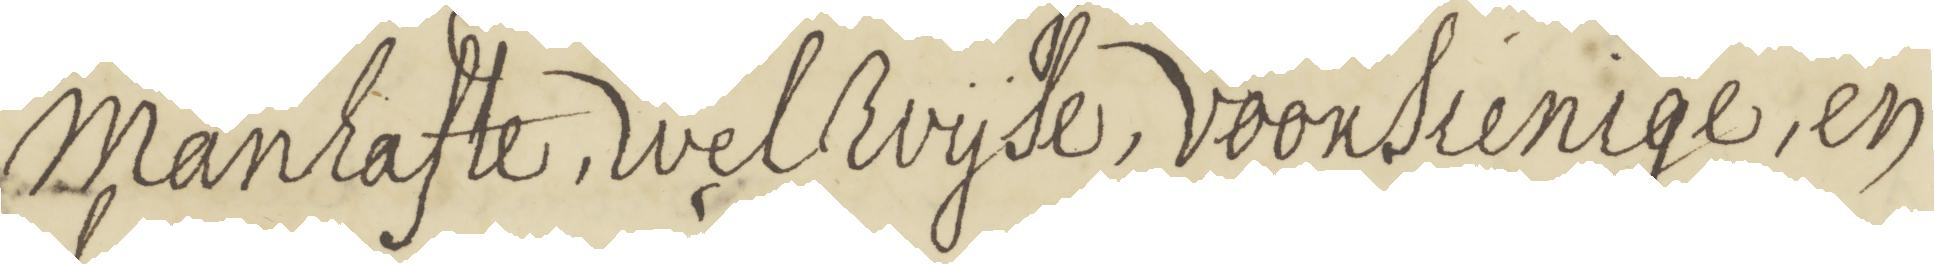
Manhafte, Wel Wijse, Voorsienige, en
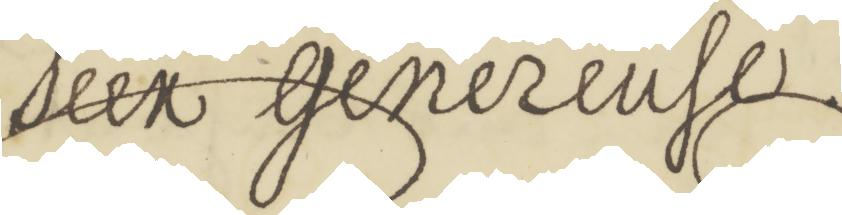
seer genereuse.
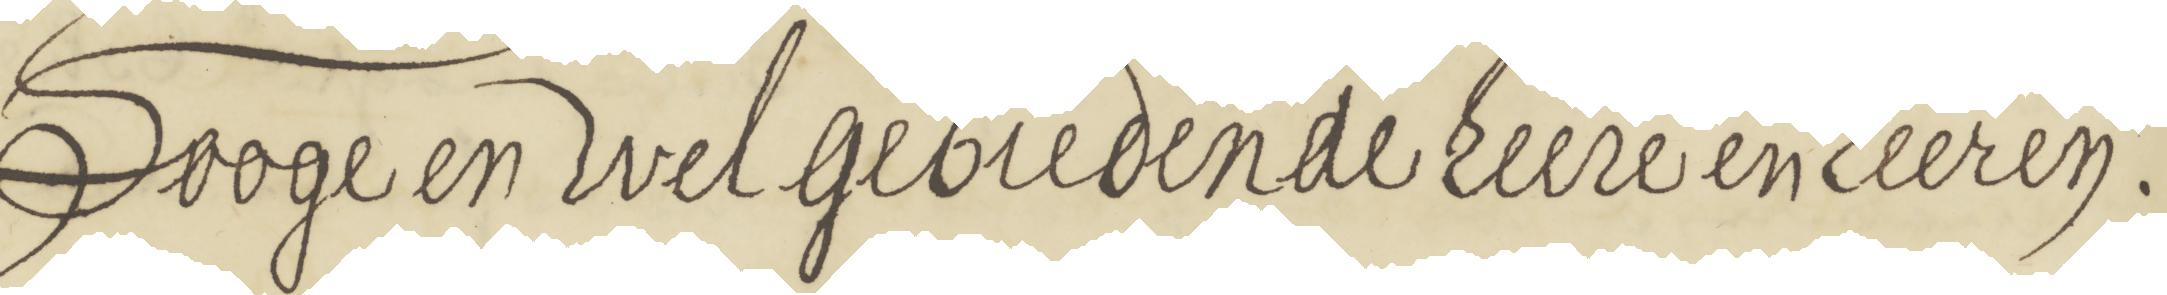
Hooge en Wel gebieden de heere en heeren.
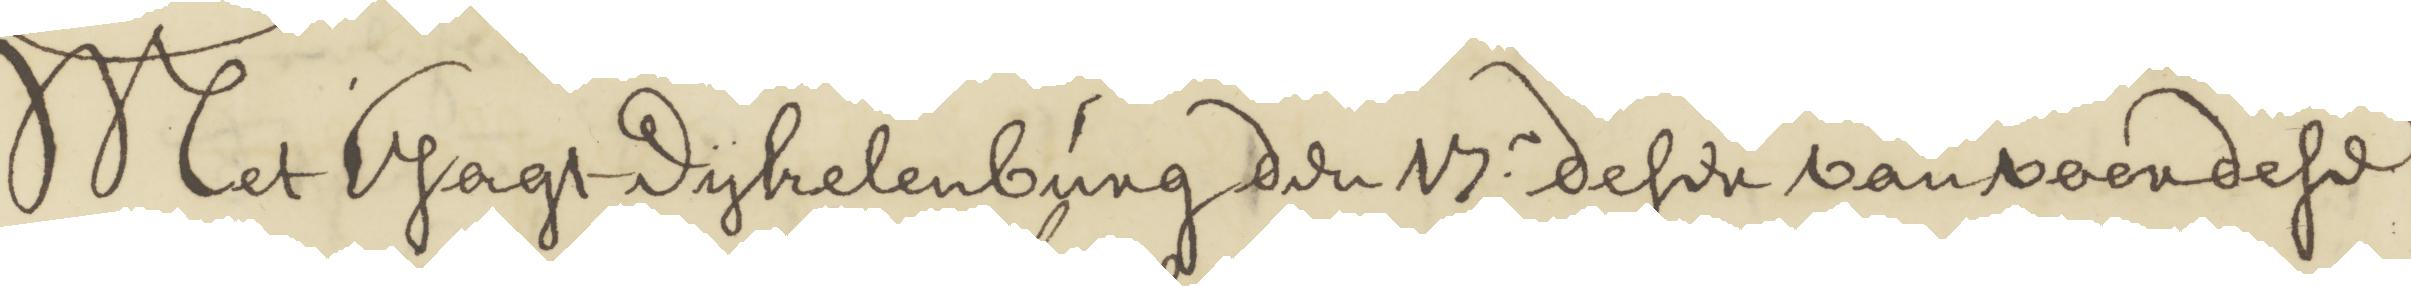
Met' t jagt Eijkelenburg den 17.' deser van voor dese
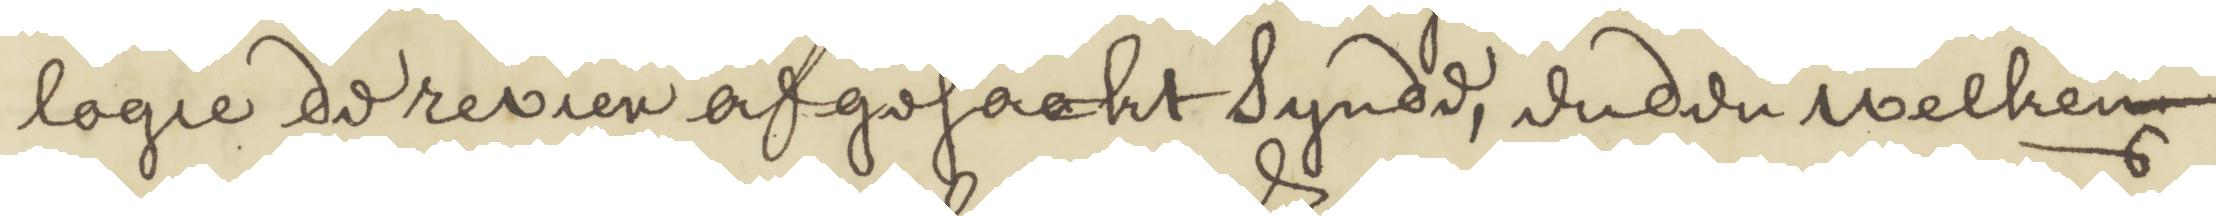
logie de revier afgesackt synde, enden welken
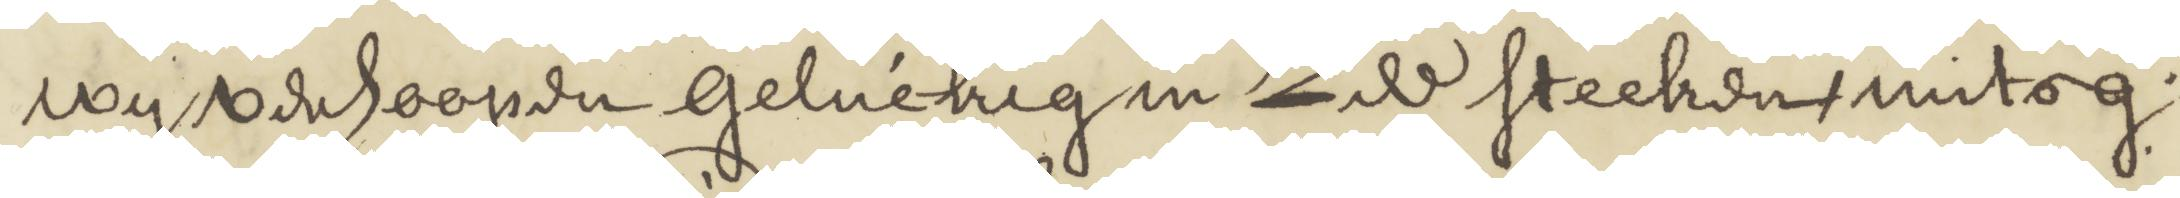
wij verhoopen geluckig in zee steeken, mitsg:s
